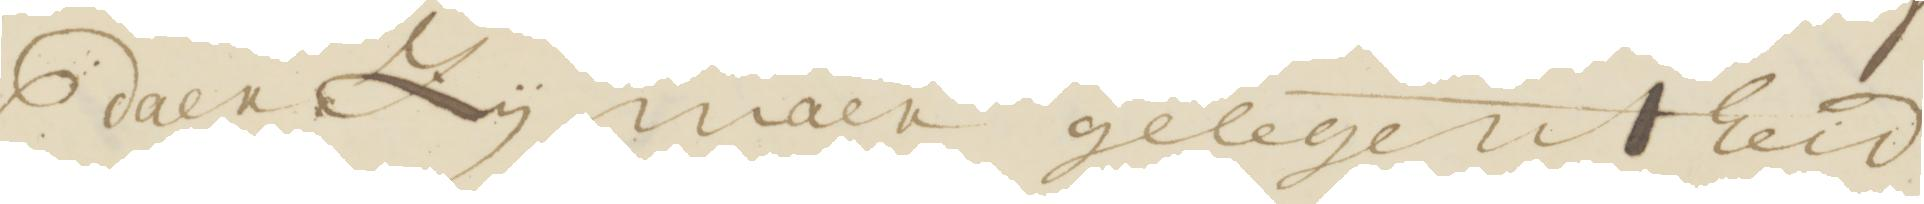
daer zij maer gelegentheid
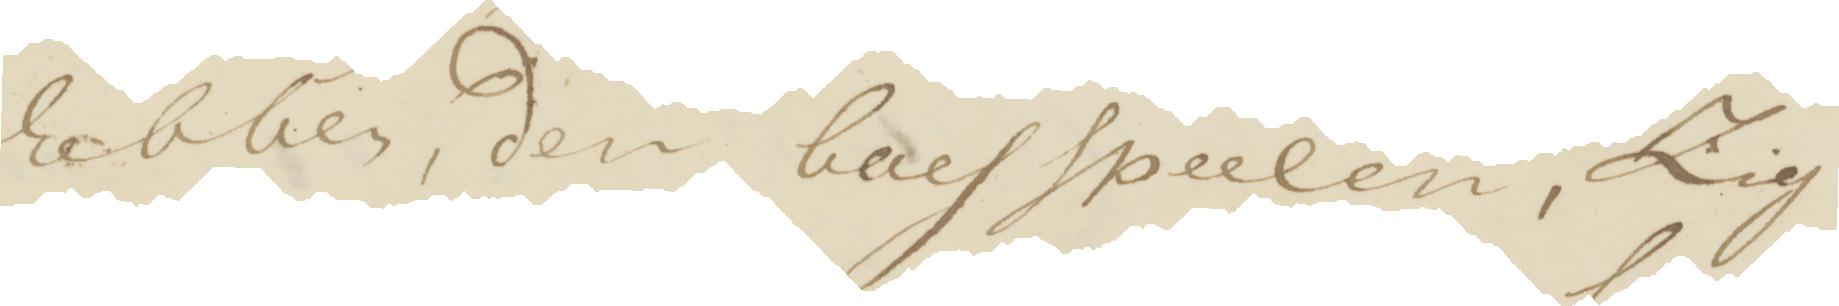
hebben, den baes speelen, zig
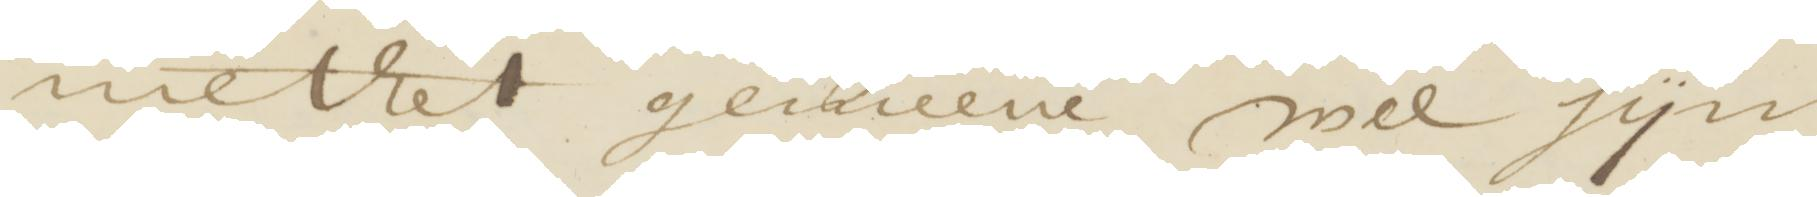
met het gemeene wel sijn
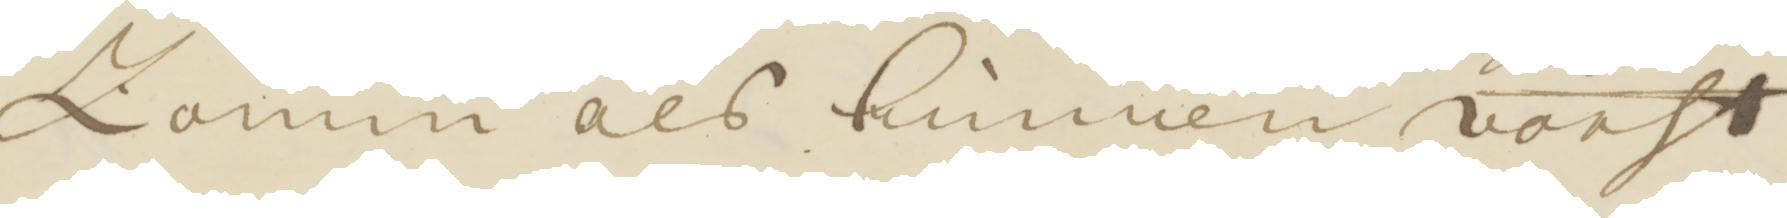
zomin als kunnen vorst
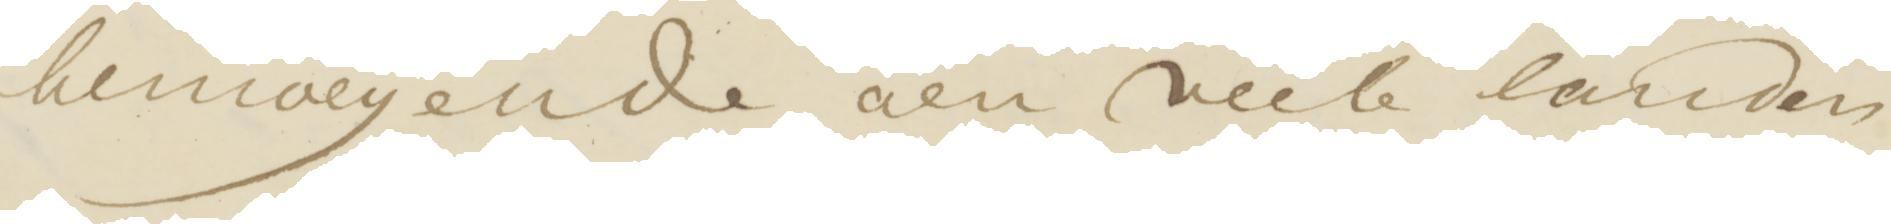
bemoeijen de aen veele landen
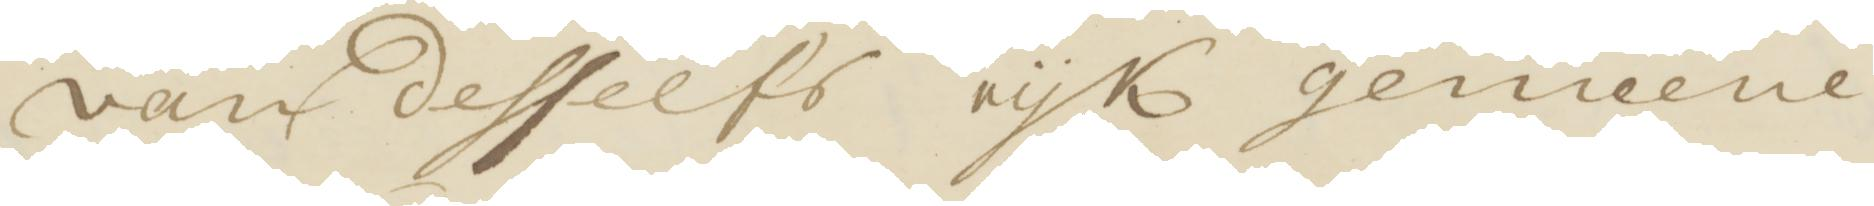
van desselfs rijk gemeene
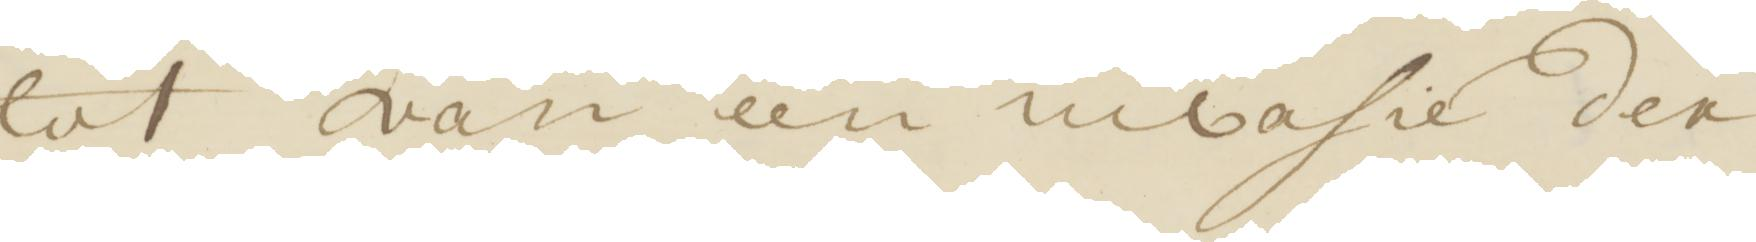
tot van een invasie der
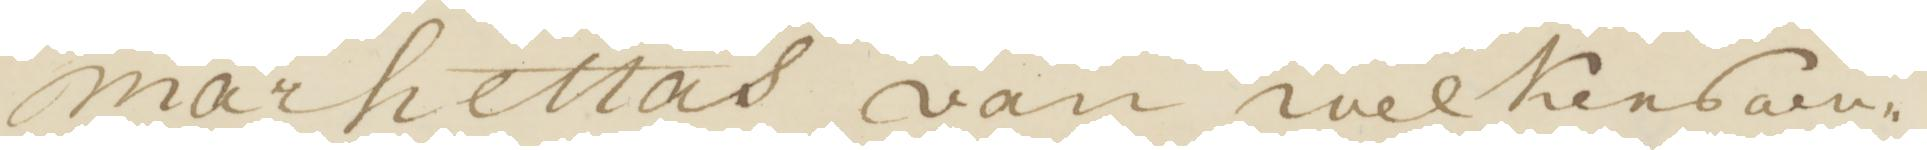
marhettas van welkersaer„
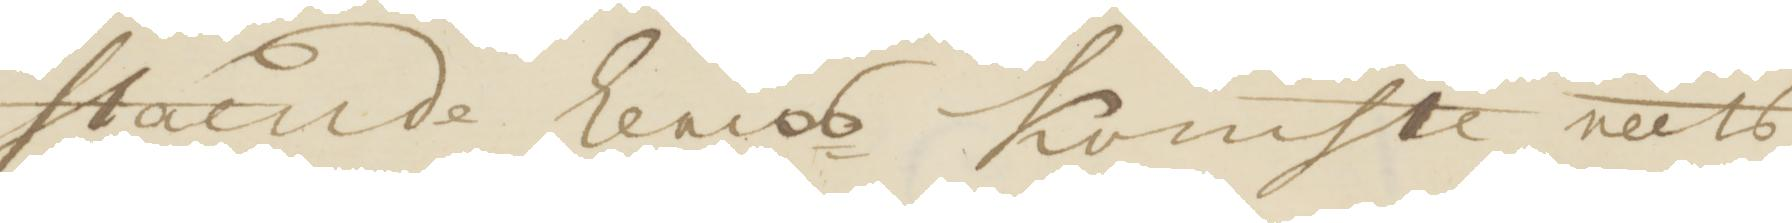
staende herw=s komste reets
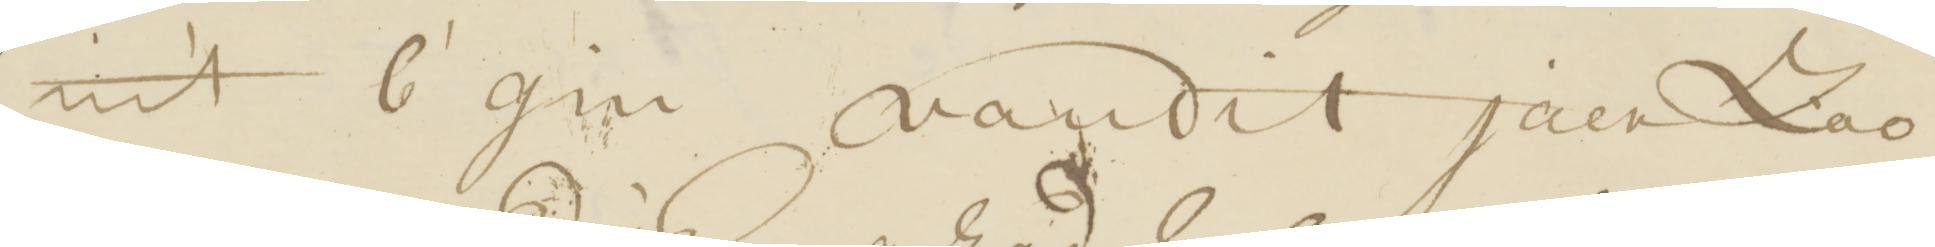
in't b' gin van dit jaer zoo
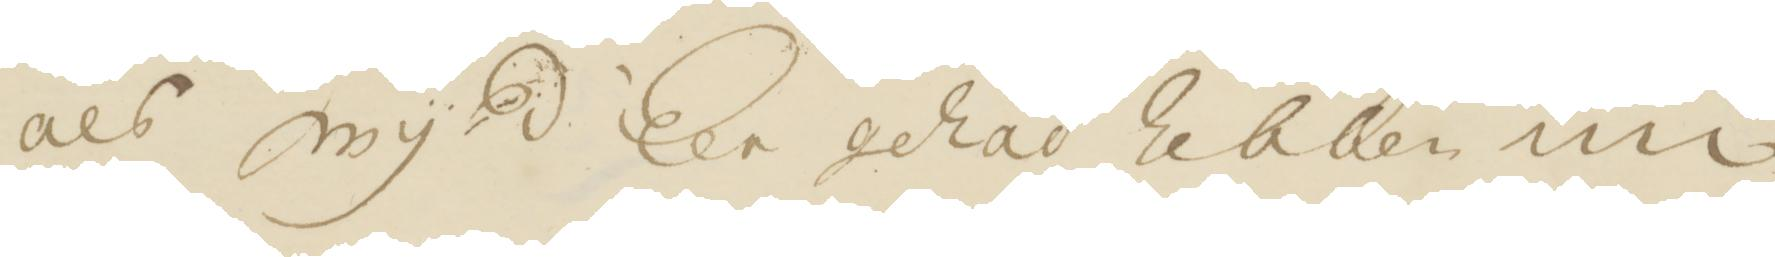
als wij d' Eer gehad hebben uw
